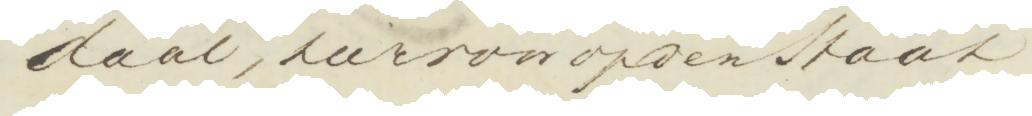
daal, hiervoor opden staat
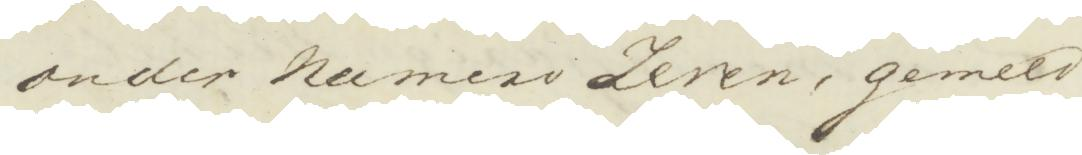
onder Numero Zeven, gemeld
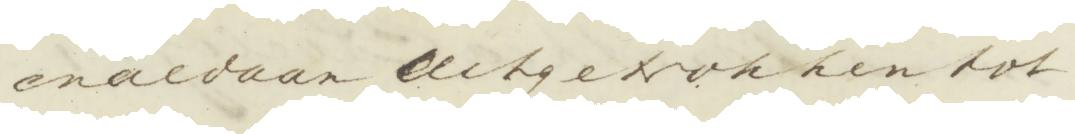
en aldaar uitgetrokken tot
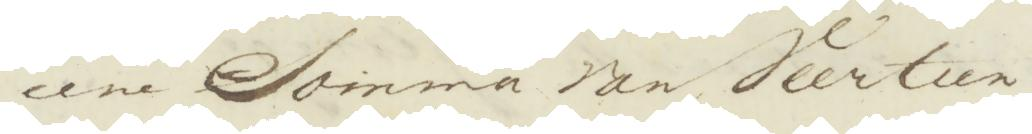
eene Somma van Veertien
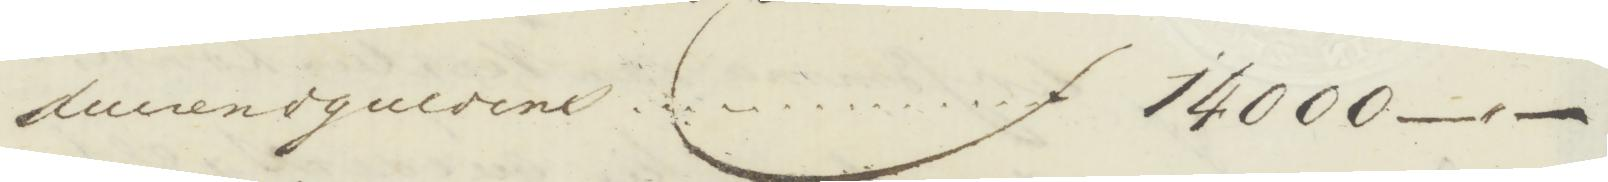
duisend guldens ƒ 14000 —: —
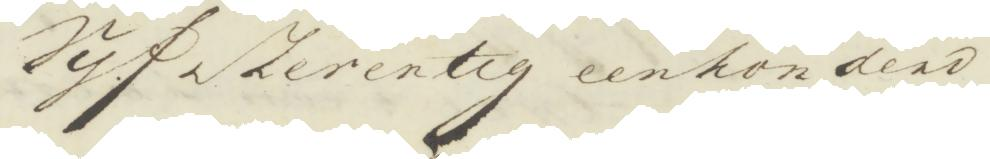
Vijf Zeventig eenhon derd
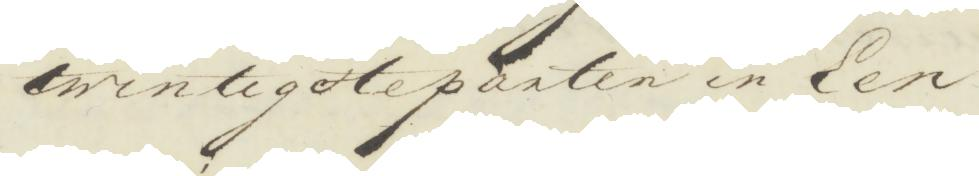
twintigste parten in Een
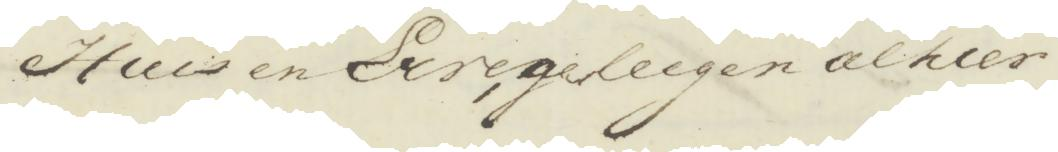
Huis en Erve, geleegen alhier
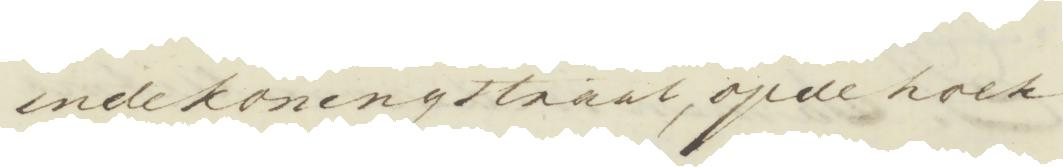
in de koningstraat, op de hoek
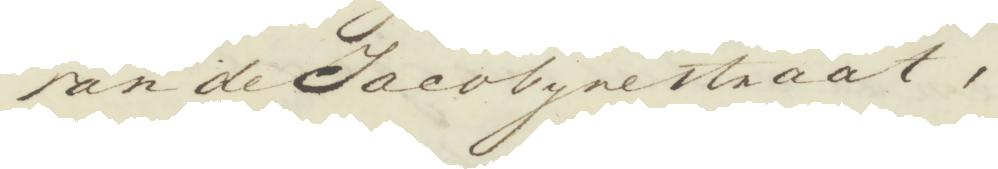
van de Iacobynestraat,
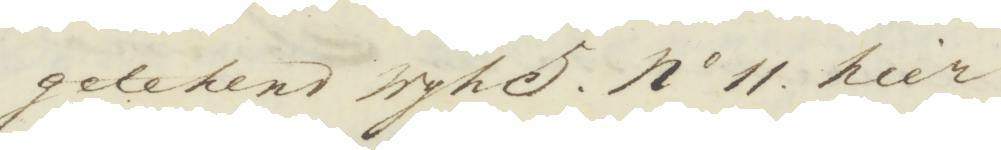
getekend wyk 5. No 11 hier
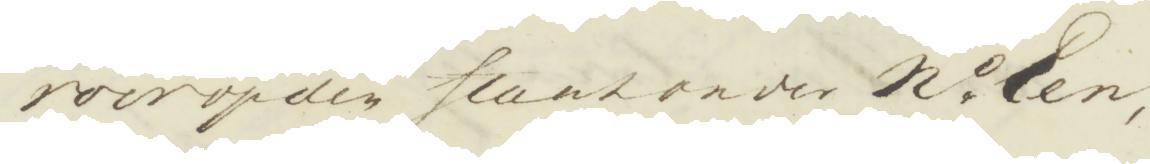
voor op den staat onder N=o Een,
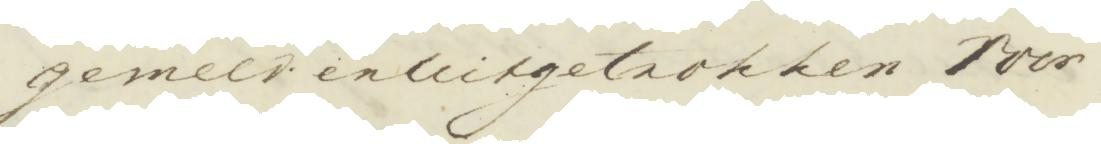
gemeld en uitgetrokken voor
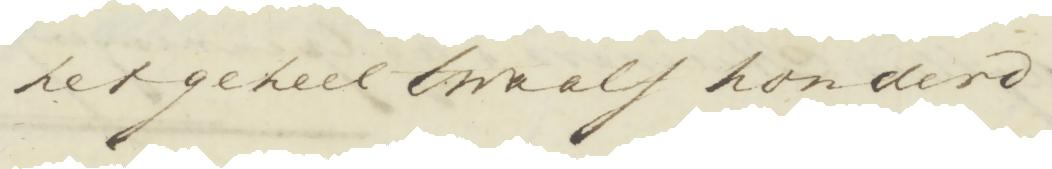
het geheel twaalf honderd
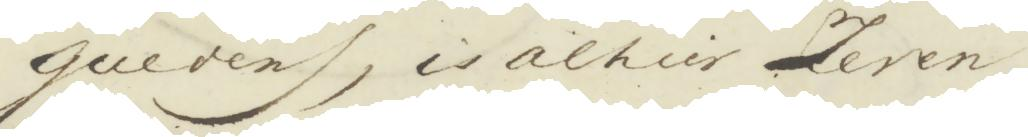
guldens, is alhier Zeven
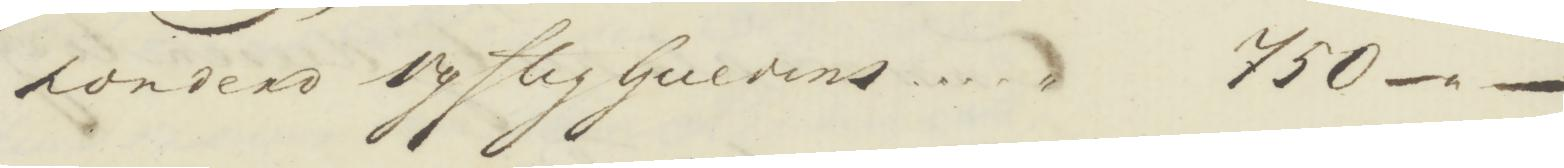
honderd vijftig Guldens „ 750 —: —
